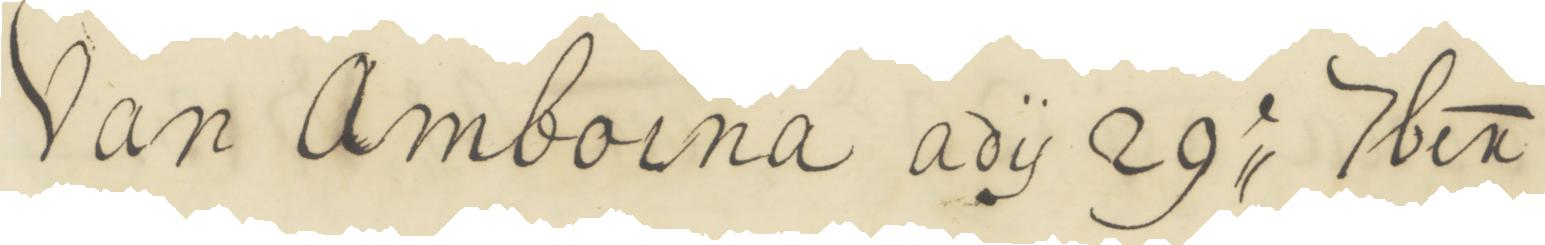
Van Amboina adij 29„e 7ber
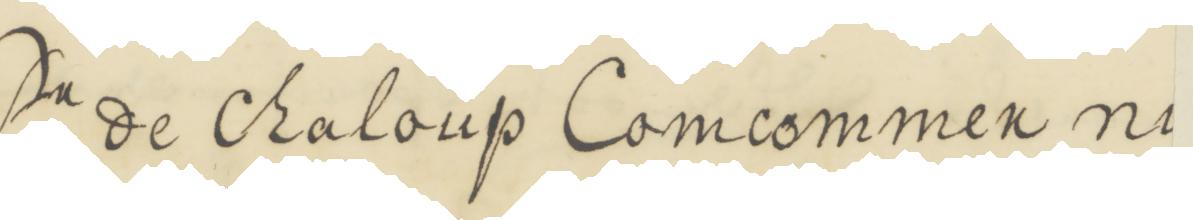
P=r de chaloup Comcommer n
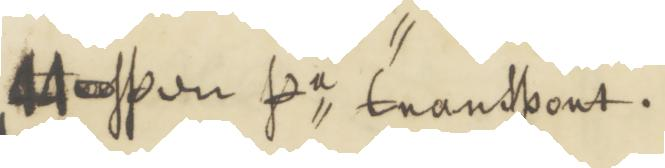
44 coppen p„r transport.
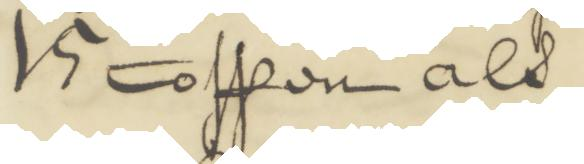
15 coppen als
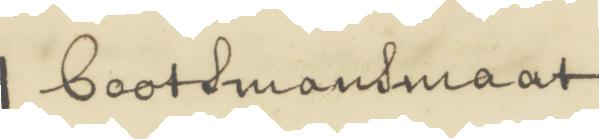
1 bootsmansmaat
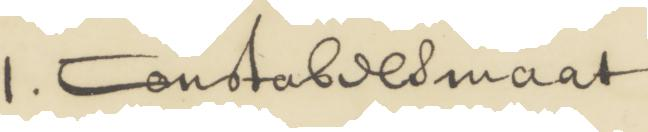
1. Constabelsmaat
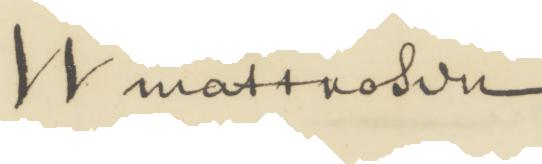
11 mattrosen
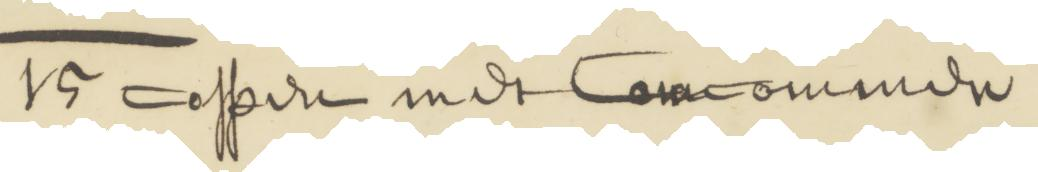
15 coppen met Comcommer
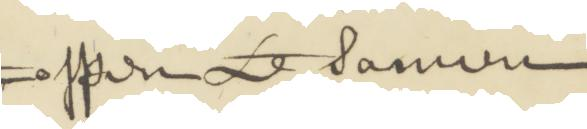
59 coppen te samen
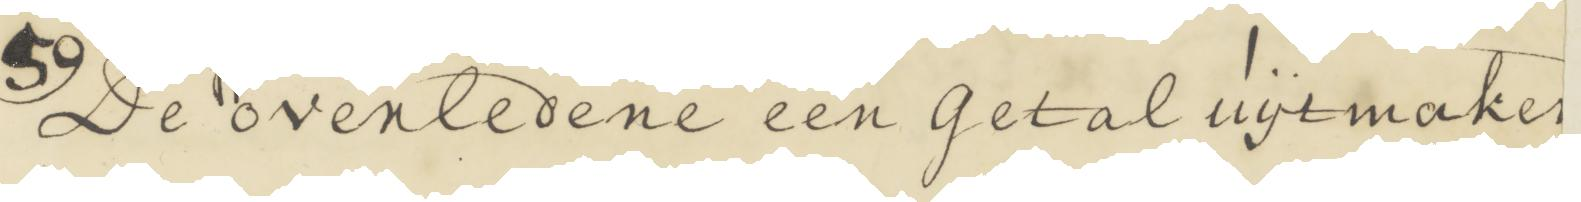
De overledene een getal uijtmaken
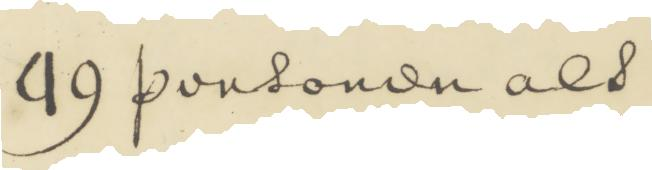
49 personen als
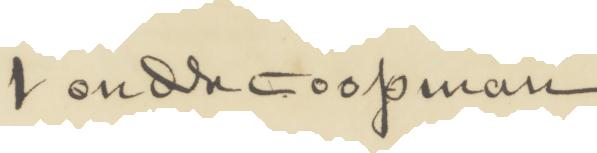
1 onder Coopman
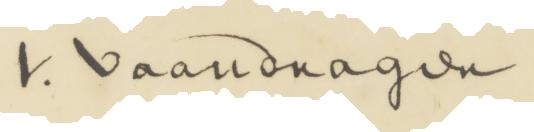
1. vaandragen
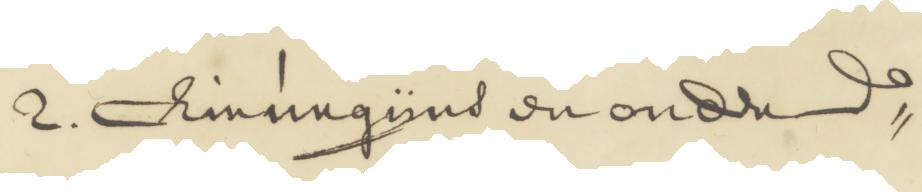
2. Chirurgijns en onder D„o
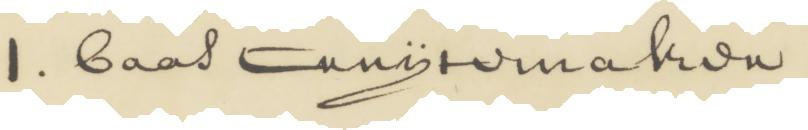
1. baas Cruijtemaker
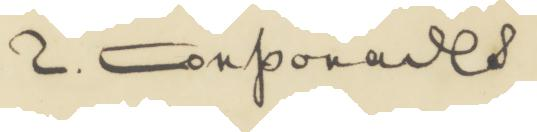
2. Corporaels
